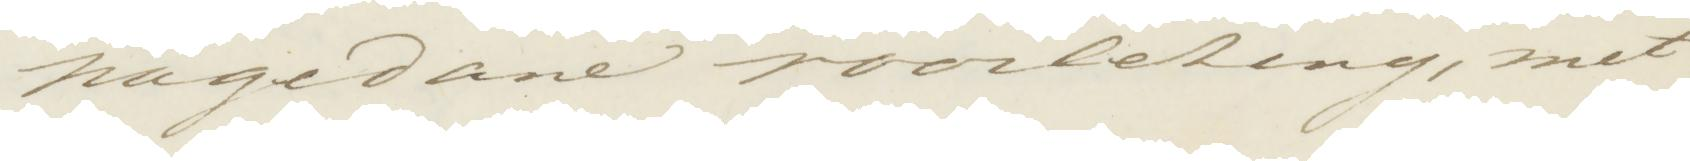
nagedane voorlezing, met
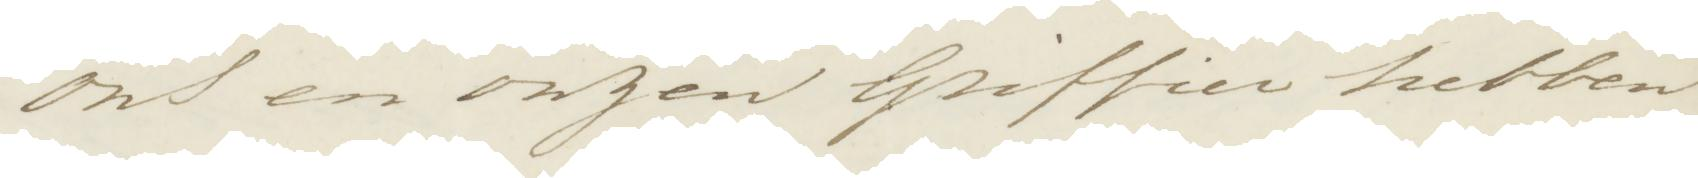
ons en onzen Griffier hebben
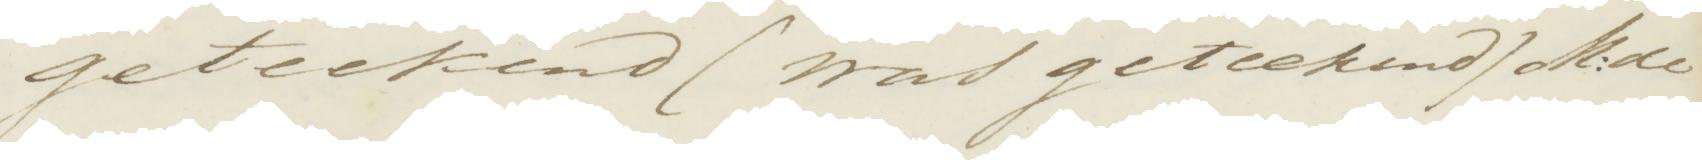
geteekend (was geteekend) M: de
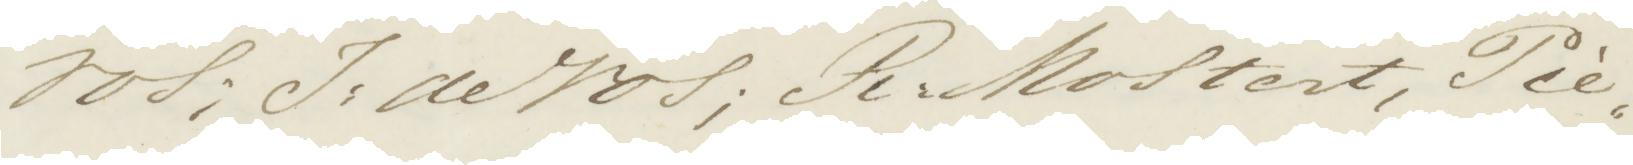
Vos: I de Vos; R: Mostert, Pie„
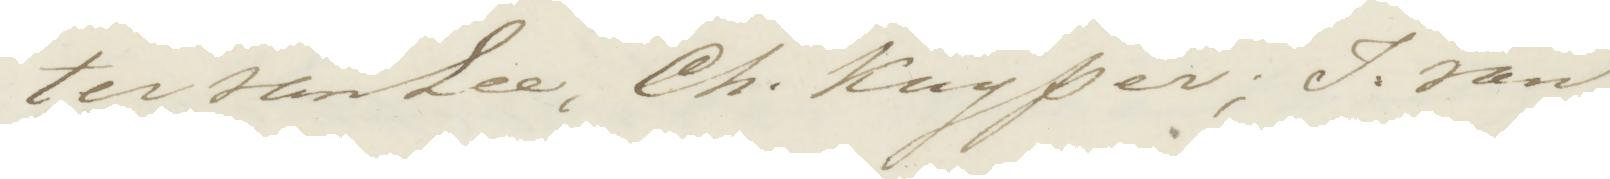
ter van Lee, Ch: Kuyper; I: van
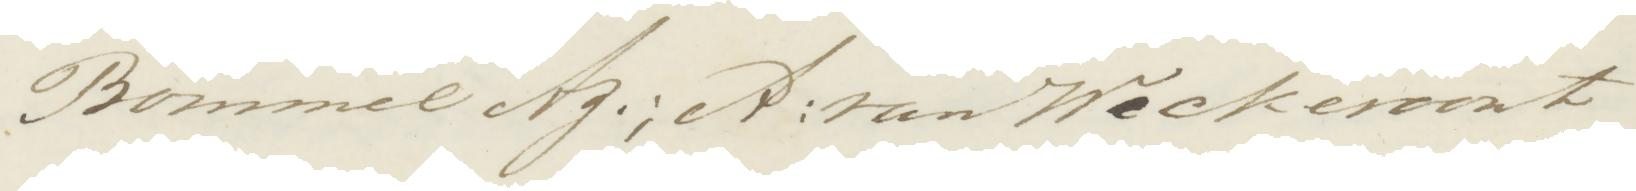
Bommel Az.; A: van Weckevoort
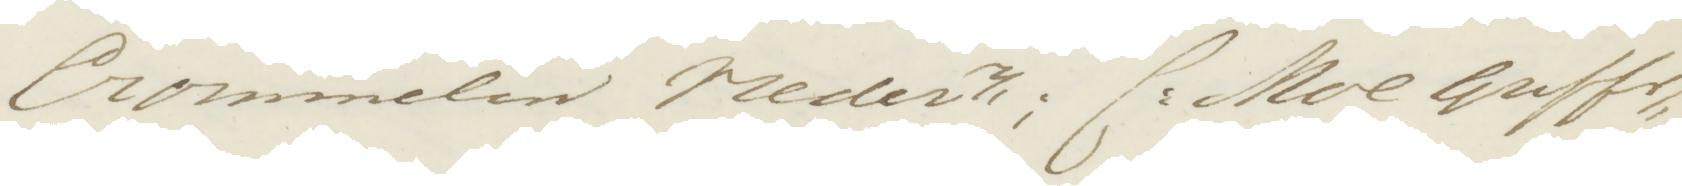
Crommelin Vreder'r; C: Mol Griff=r
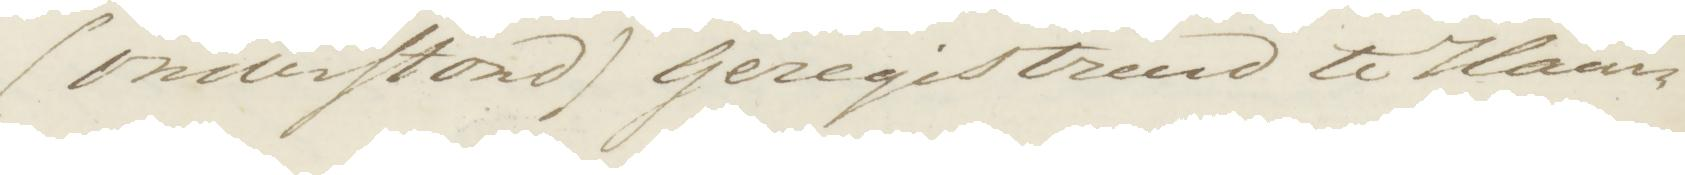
(onderstond) Geregistreerd te Haar„
